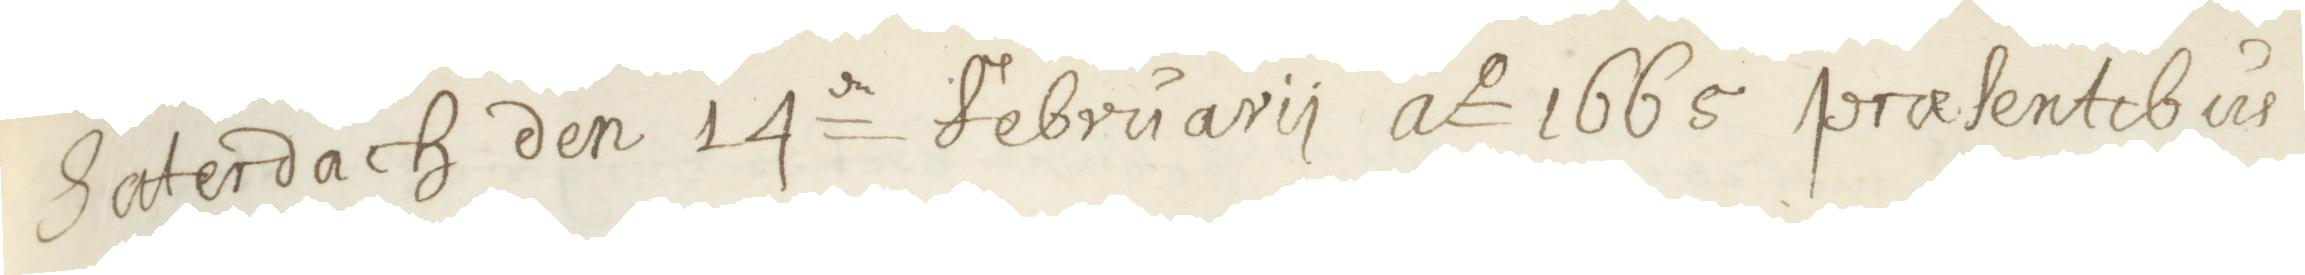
Saterdach den 14=en Februarij a=o 1665 praesentibus
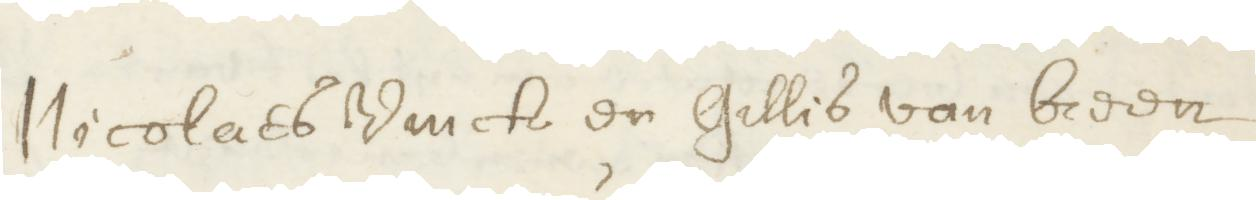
Nicolaes Vinck en Gillis van breen
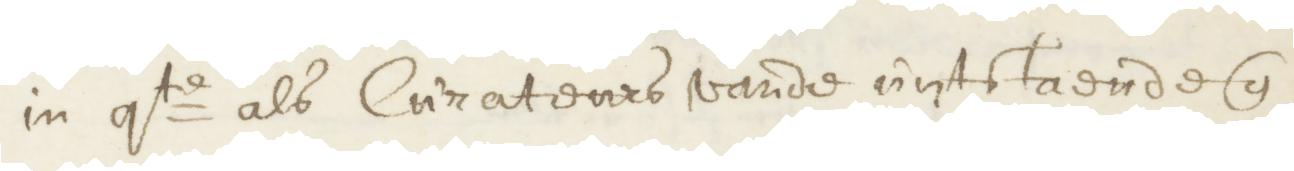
in q=te als Curateurs vande uytstaende ende
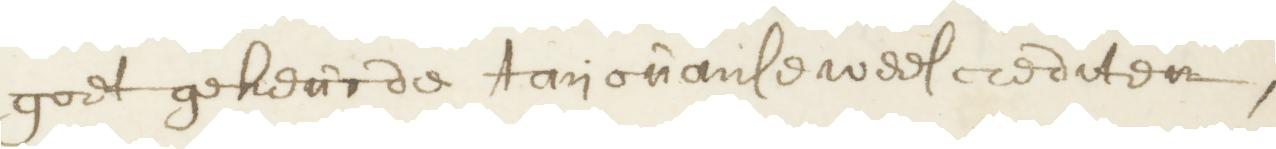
goetgekeurde taijouanse weescrediten
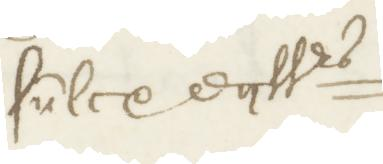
sulcx eijss=rs
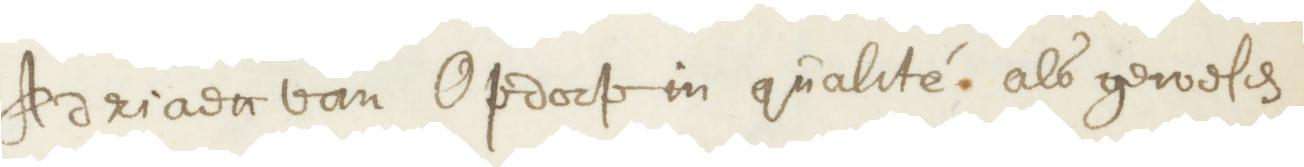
Adriaen van Opdorp in qualité als gewesen
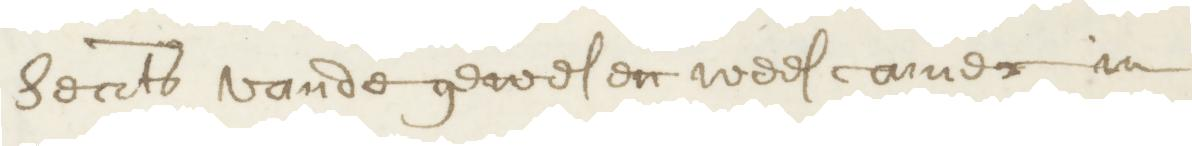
secrts vande gewesen weescamer in
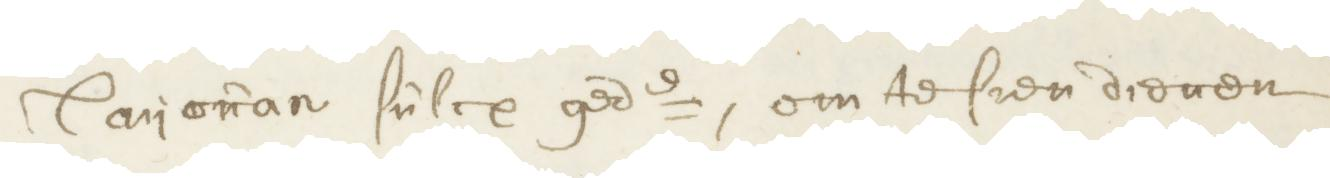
Caijouan sulcx ged=e, om te sien dienen
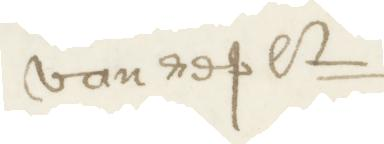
van repl=
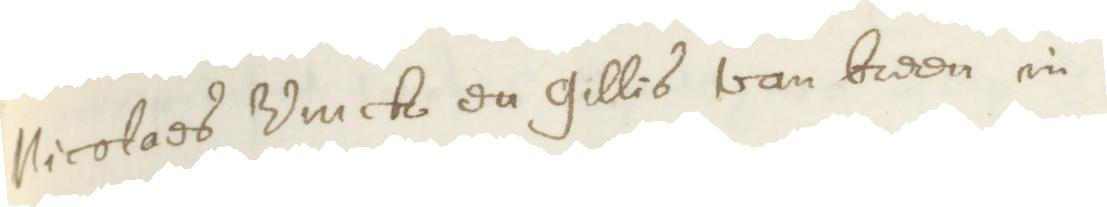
Nicolaes Vinck en gillis van breen in
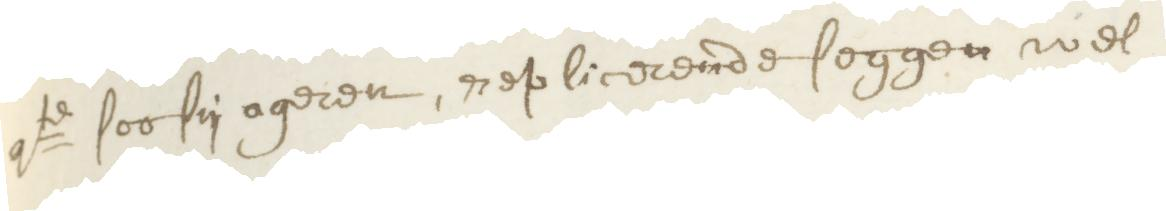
q=te soo sij ageren, replicerende seggen wel
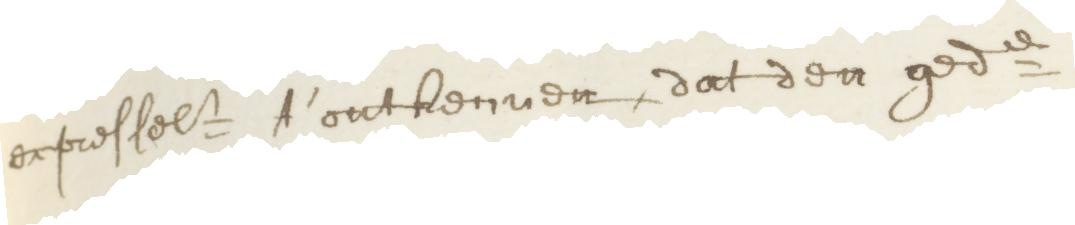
expresselijk t'ontkennen, dat den ged=e
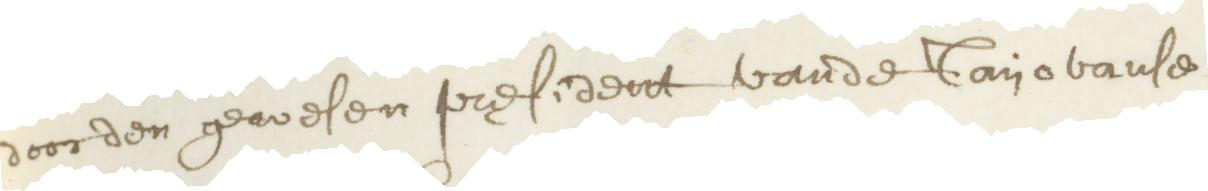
door den gewesen president vande Taijovanse
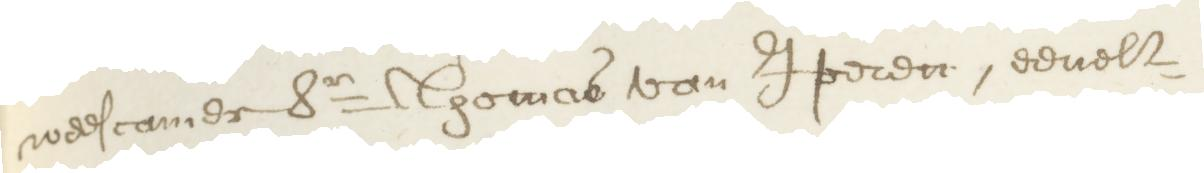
weescamen 8=r Thomas van Heeren, eenelijk
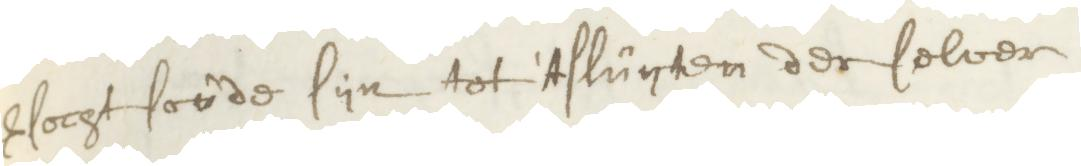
versocht soude sijn tot ’t sluijten der selver
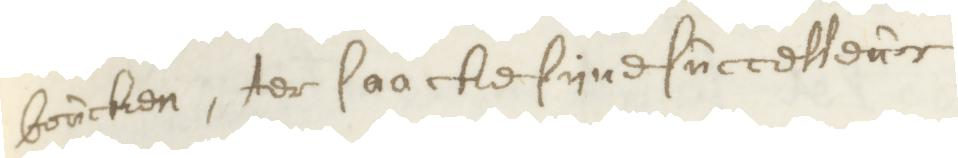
boucken, ter saacke sijne successeur
